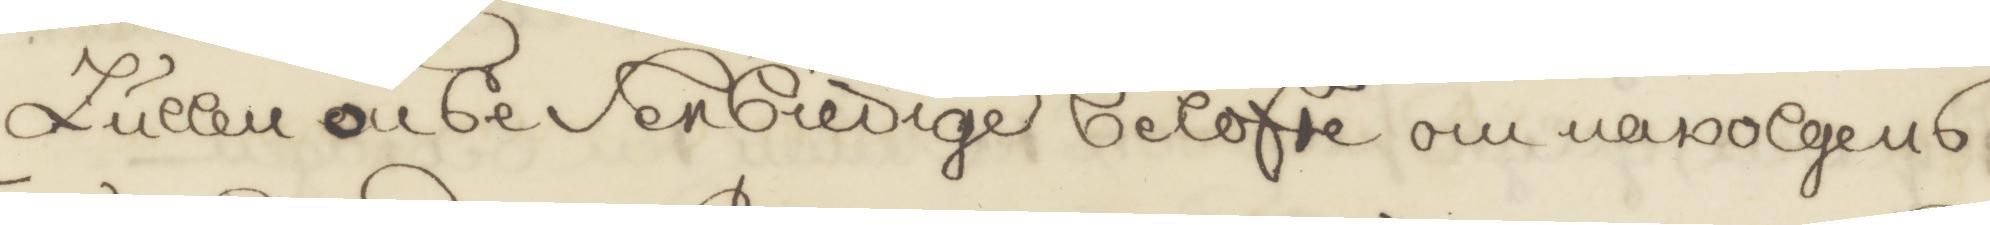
zullen onse Eerbiedige belofte om navolgens
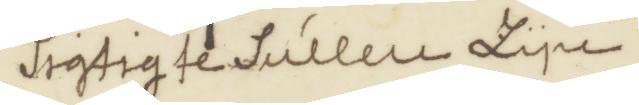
sigtig te sullen zijn
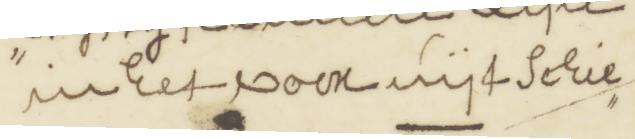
in het voor uijtschie„
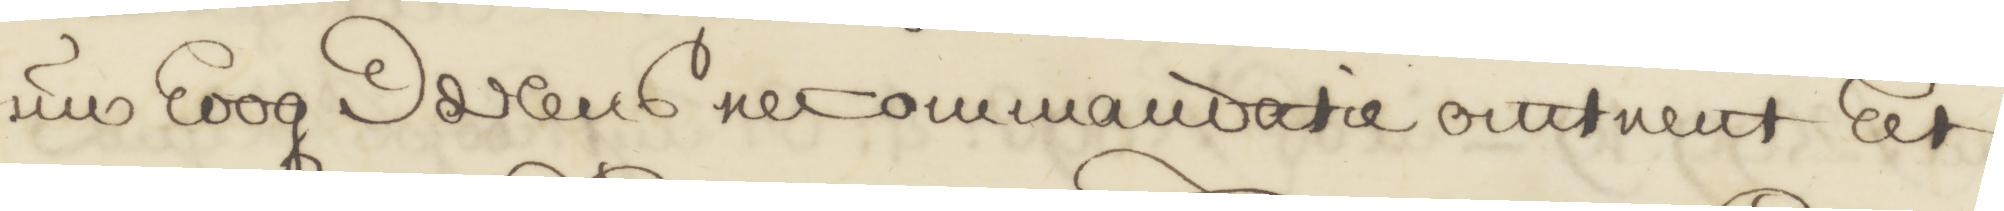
uw hoog Edelens recommandatie omtrent het
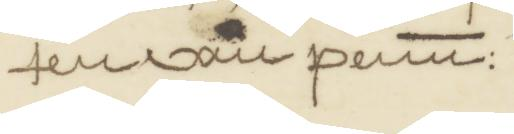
ten van penn:
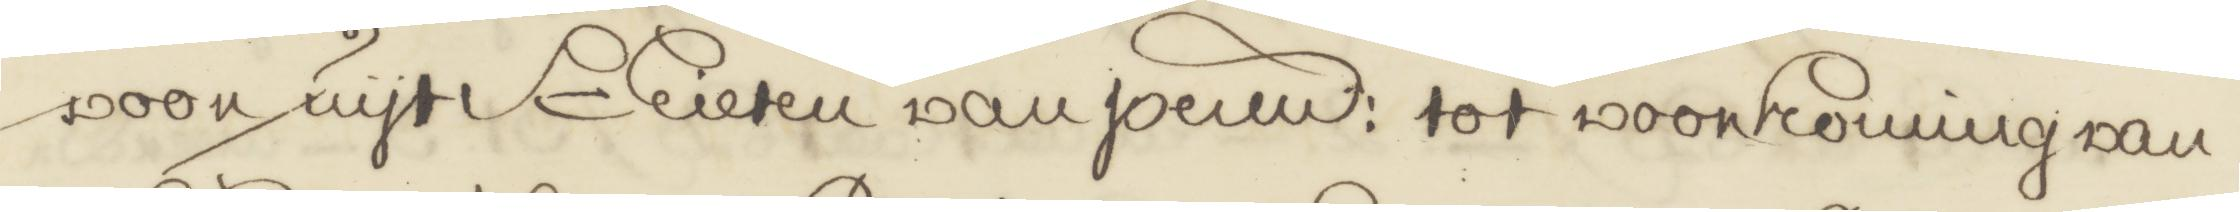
voor uijt schieten van penn: tot voorkoming van
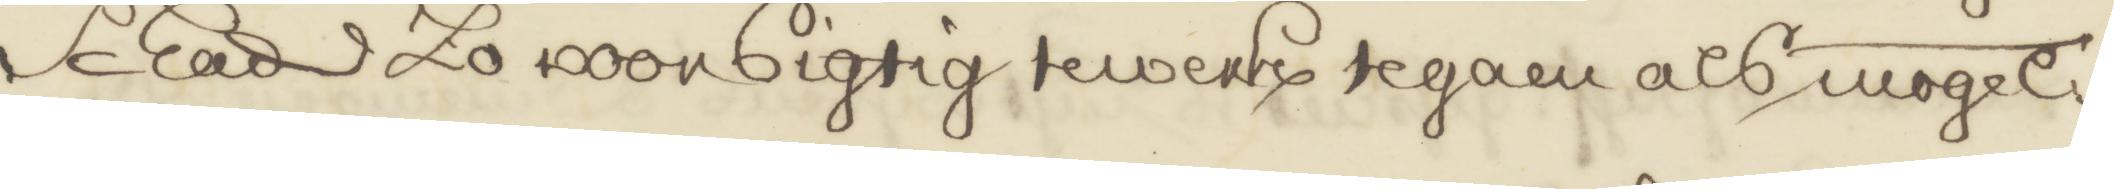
schade zo voorsigtig tewerk te gaen als mogelijk
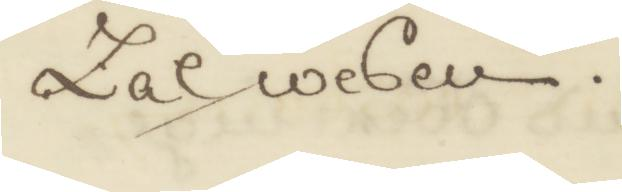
zal wesen.
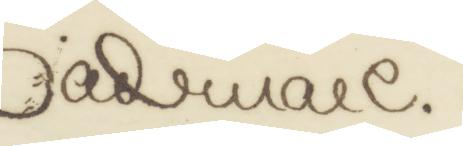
Nademael.
